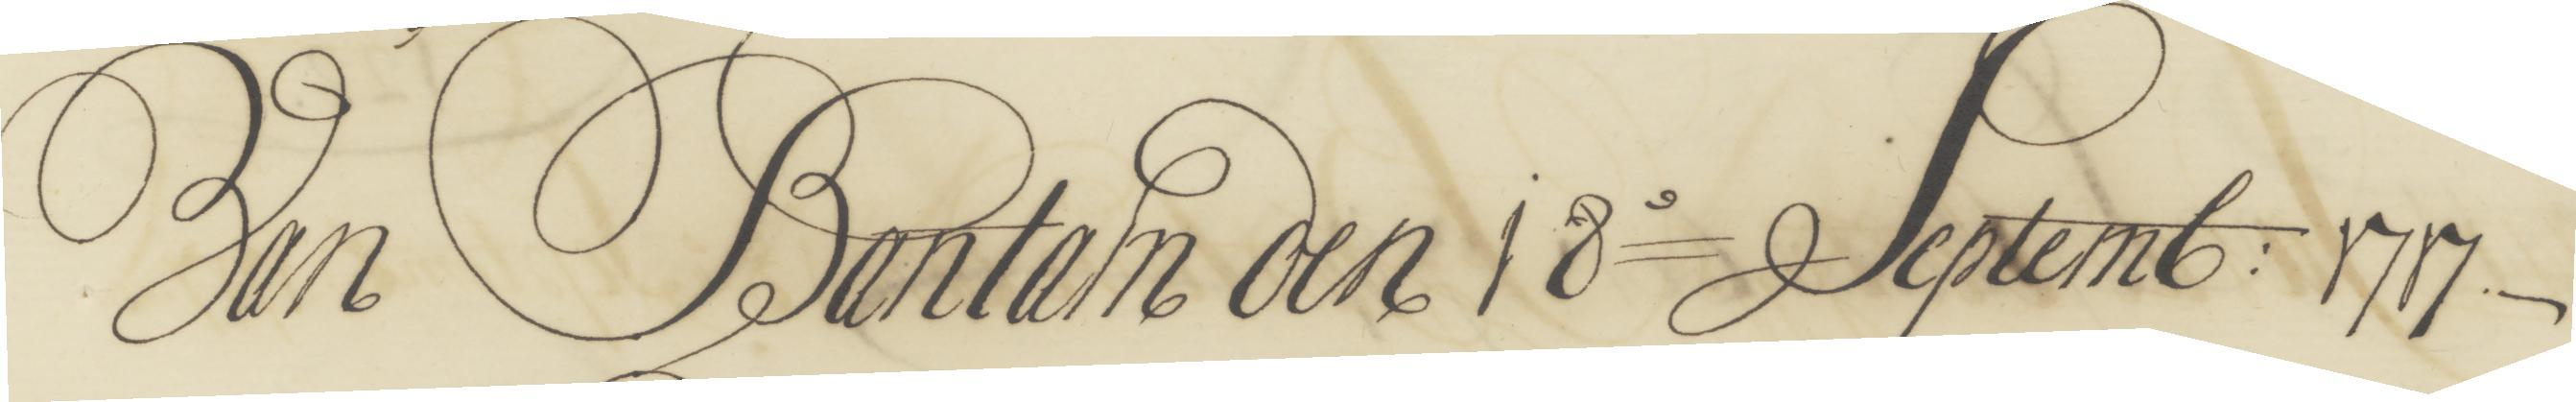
Van Bantam den 18:e Septemb: 1717.—
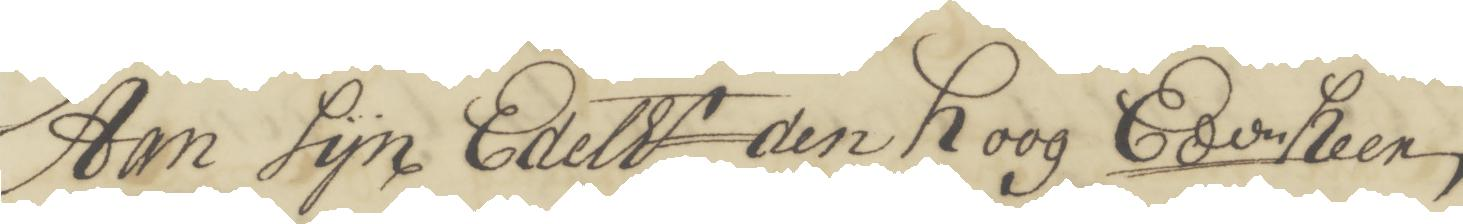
Aan sijn Edelh=t den hoog Ed=en heer
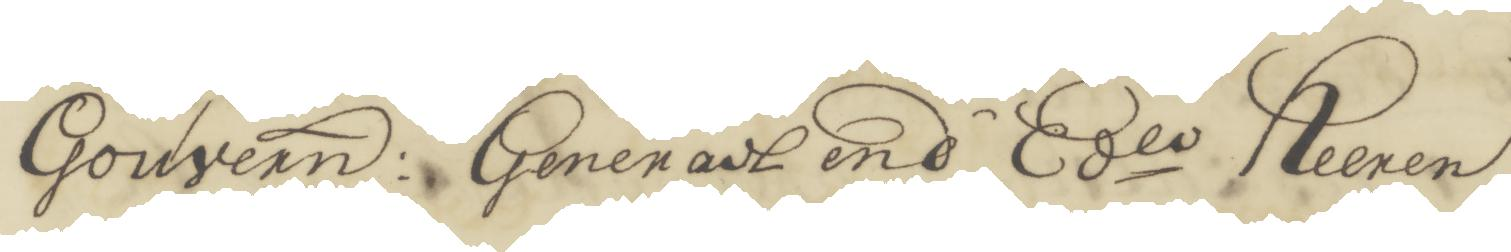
Gouvern: Generael en d’ Ed=le heeren
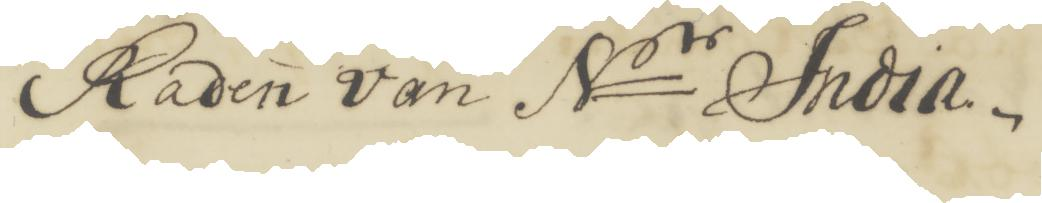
Raden van N=ts India.
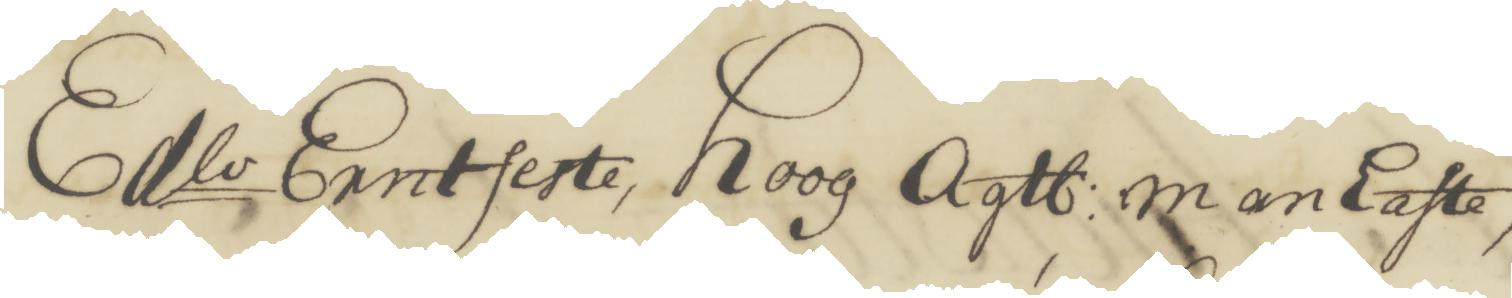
Ed=le Erntfeste, Hoog Agtb: manhafte,
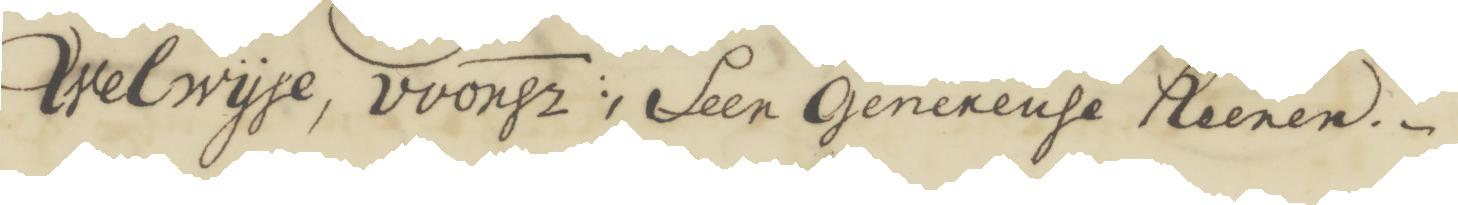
wel wijse, voorsz:, seer genereuse Heeren.—
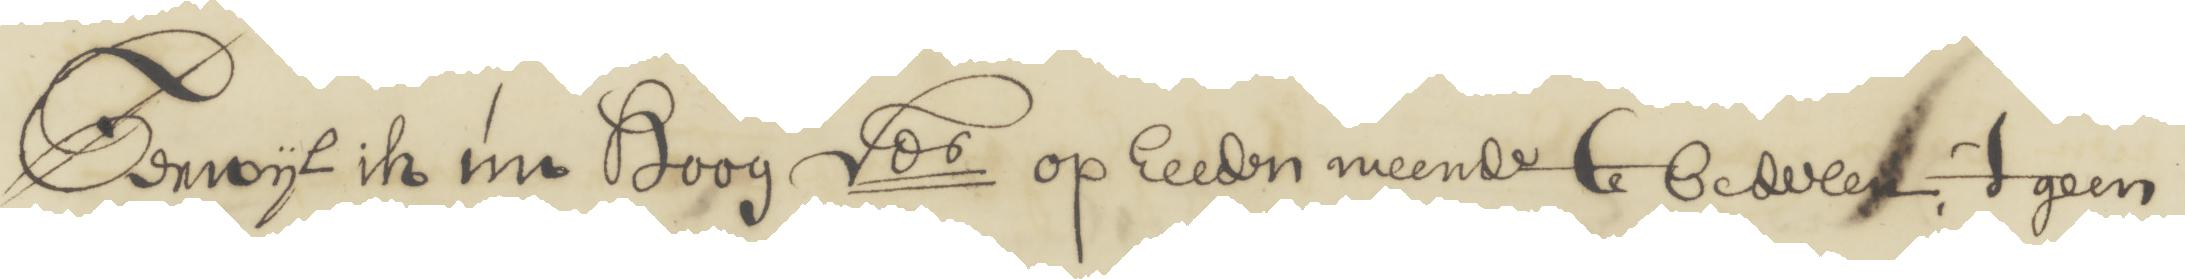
Terwijl ik uw Hoog Ed=s op heeden meerde te bedelen, ’t geen
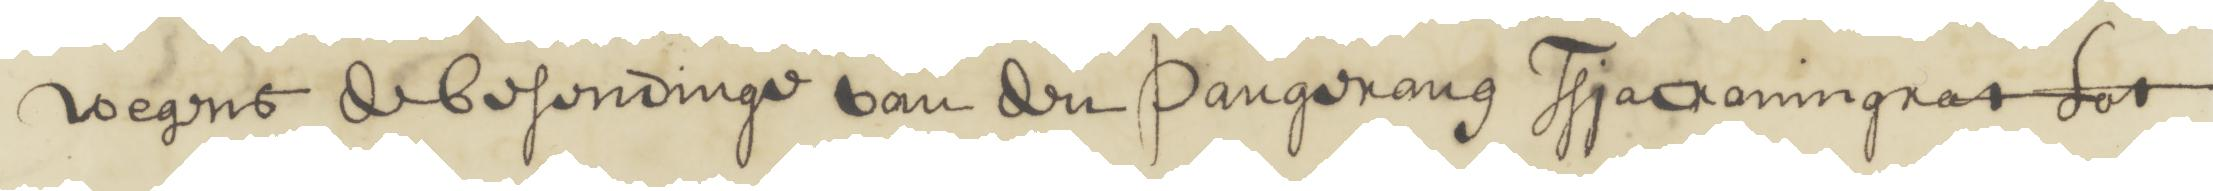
wegens de besendinge van den Pangerang Tsjacroningrat tot
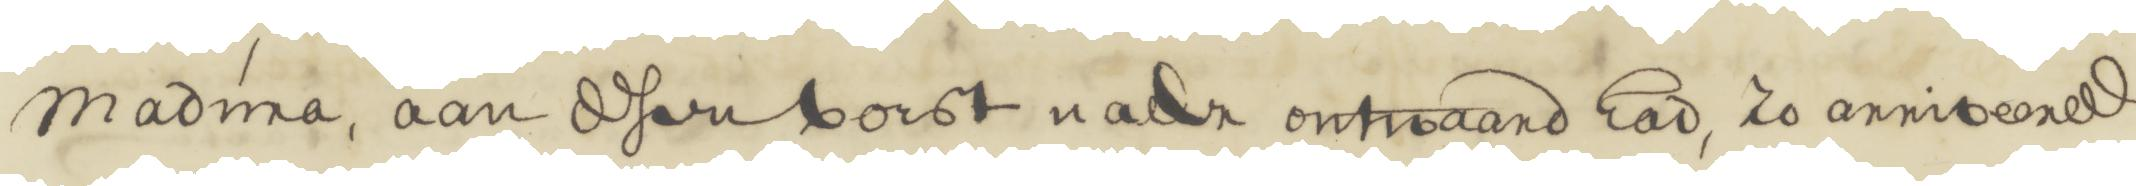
madura, aan desen vorst nader ontwaard had, zo arriveerde
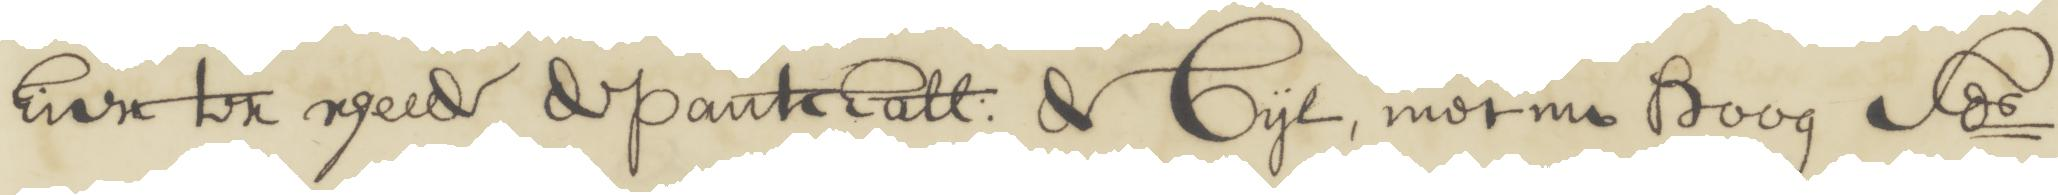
hier ter rheede de pantchall: de bijl, met uw Hoog Ed=s
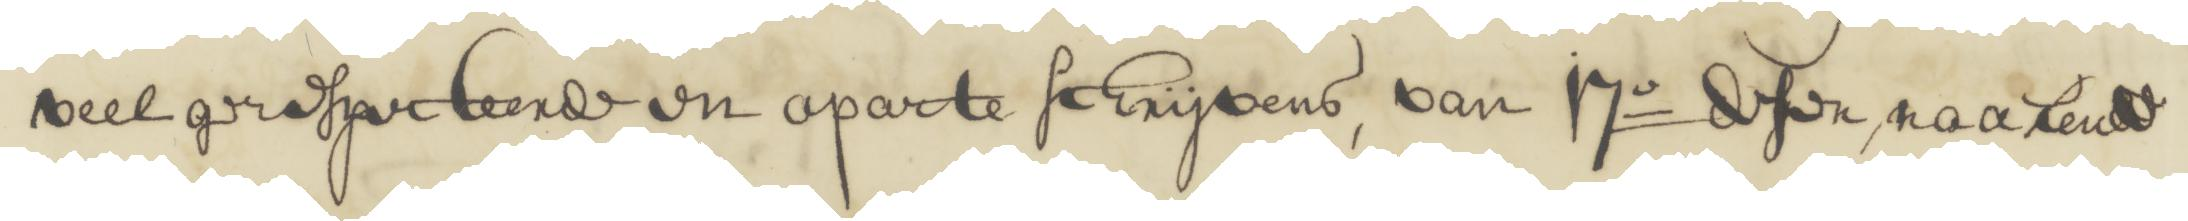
veel gerespecteerde en aparte schrijvens, van 17=e deser, raakende
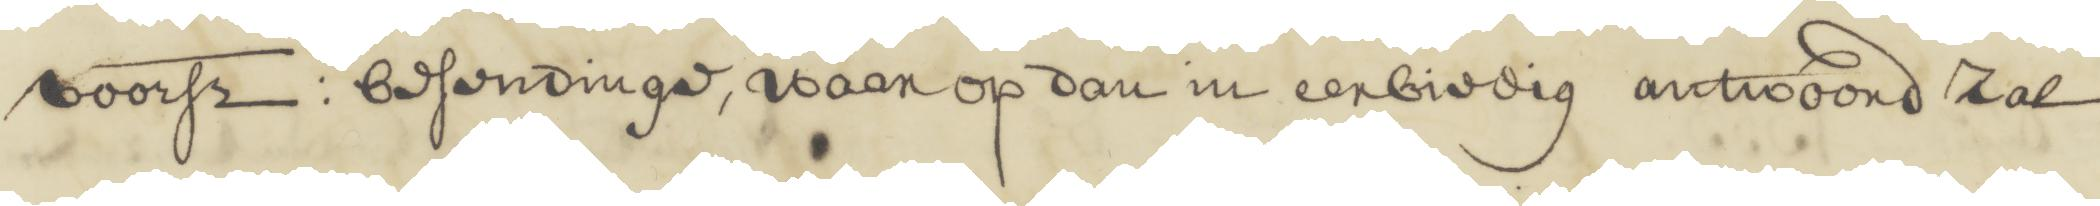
voorsz: besendinge, waar op dan in eerbiedig antwoord zal
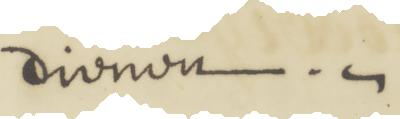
dienen.—
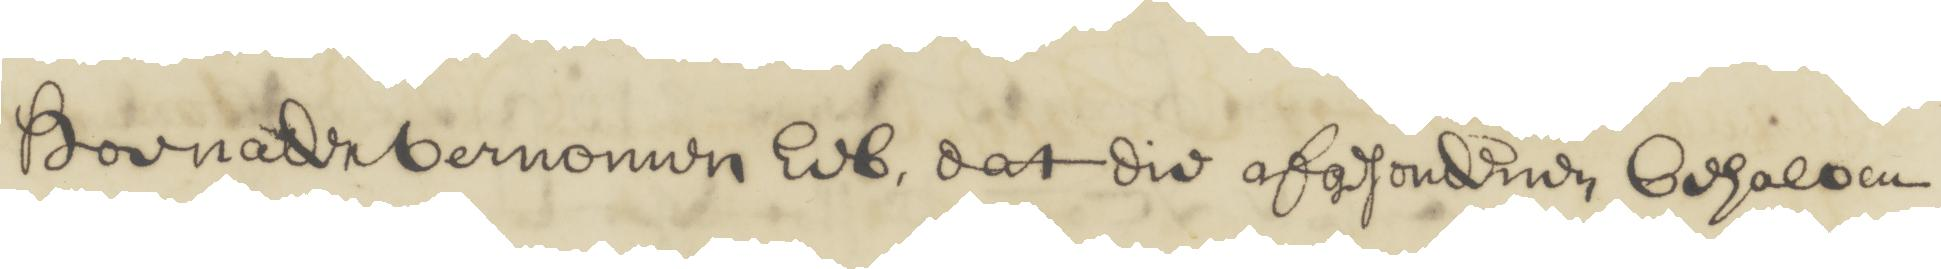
Hoe nader vernomen heb, dat die afgesondenen behalven
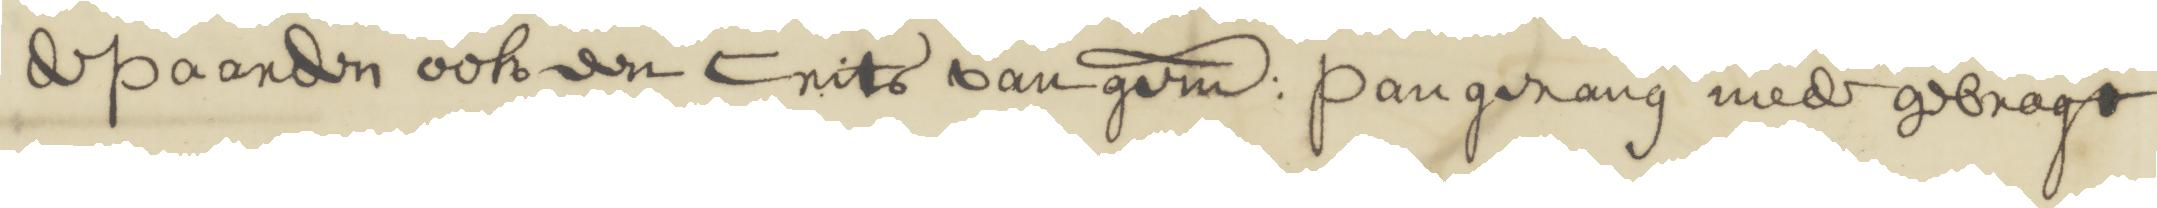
de paarden ook een crits van gem: pangerang mede gebragt
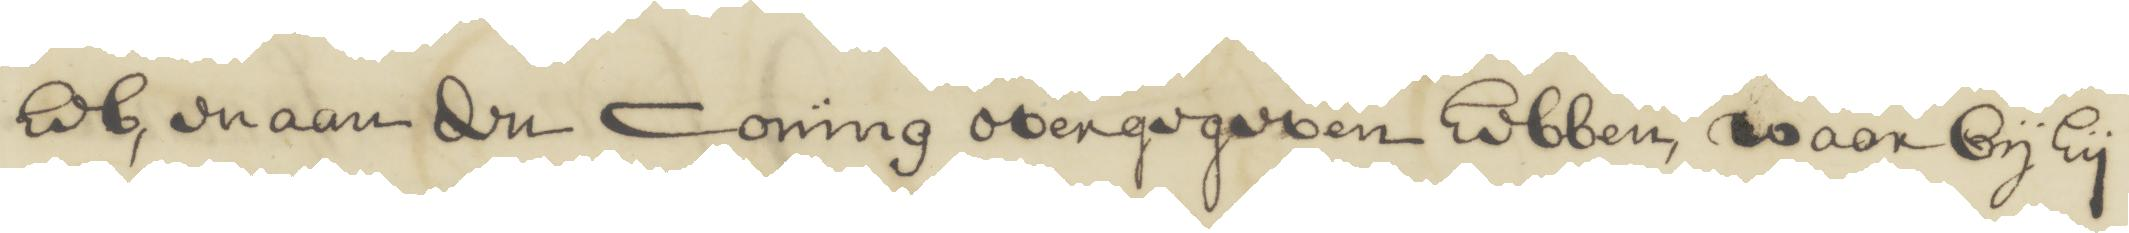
heb, en aan den Coning overgegeven hebben, waar bij hij
